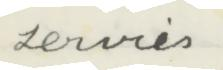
servies
